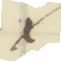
ƒ
